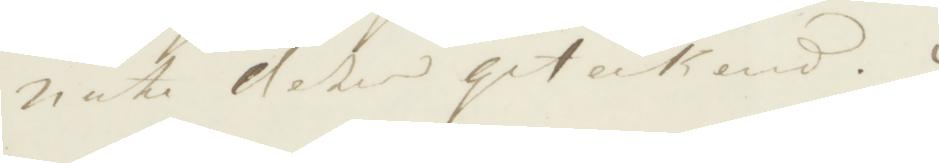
nute deze geteekend.
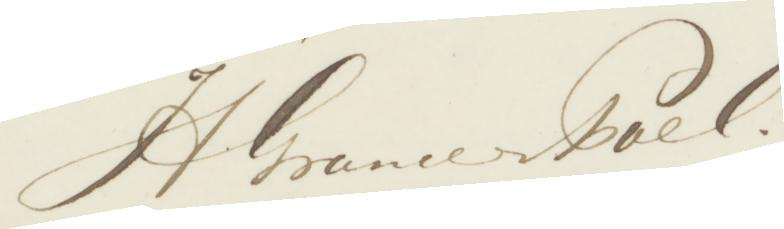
H G van der Poel.
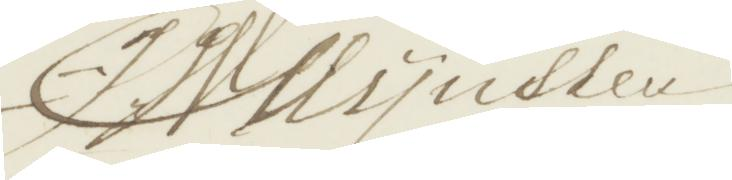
J W Mijnsten
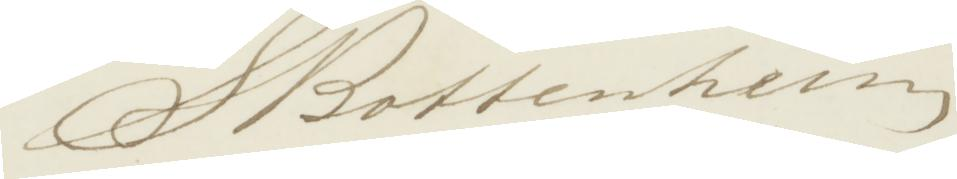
S Bottenheim
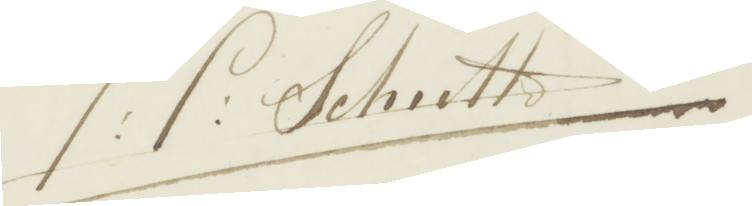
J: C: Schutte
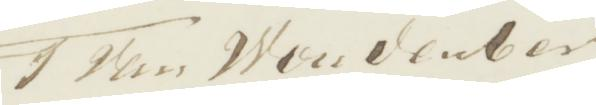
T van Woudenberg
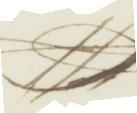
HD
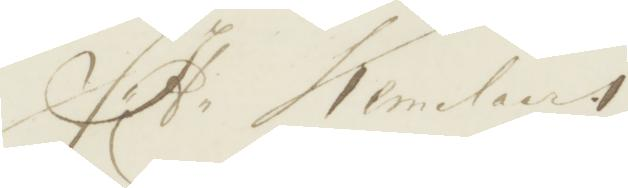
J H: Kemelaar./
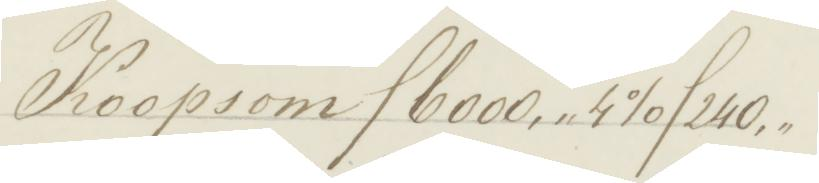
Koopsom ƒ6000, „ 4% ƒ240, „
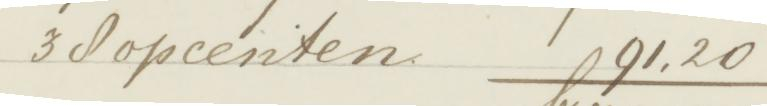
38 opcenten 91,20
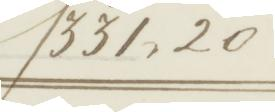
ƒ331,20
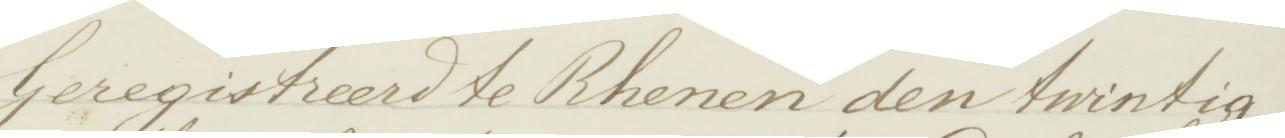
Geregistreerd te Rhenen den twintig
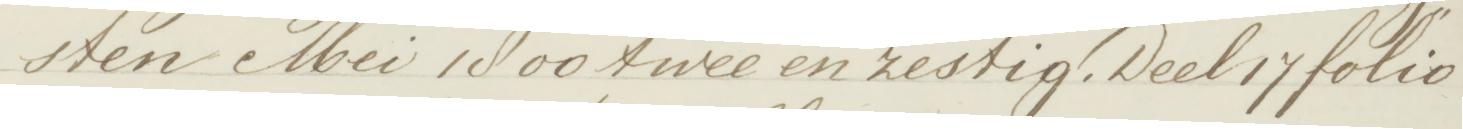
sten Mei 1800 twee en zestig. Deel 17 folio
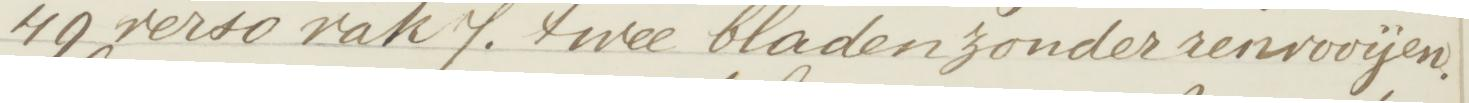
49 verso vak 7. twee bladen zonder renvooijen,
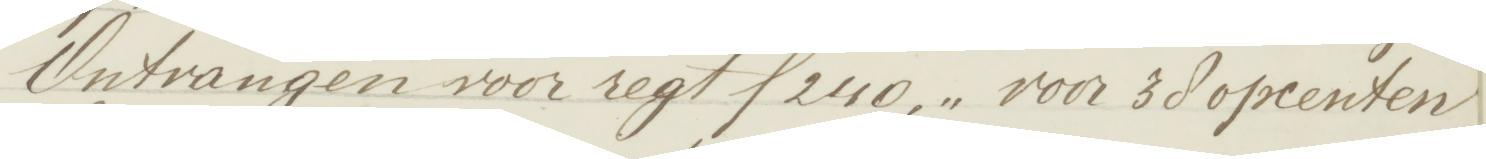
Ontvangen voor regt ƒ240, „ voor 38 opcenten
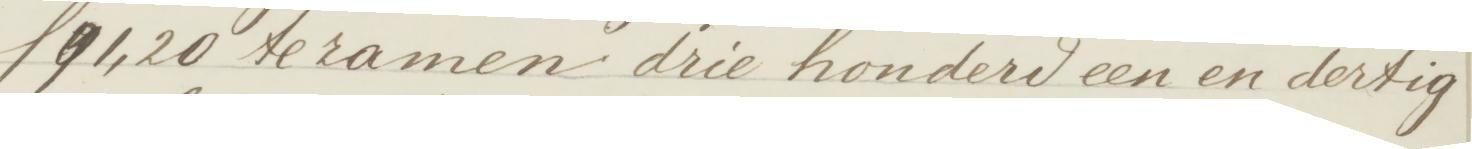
ƒ91,20 tezamen drie honderd een en dertig
